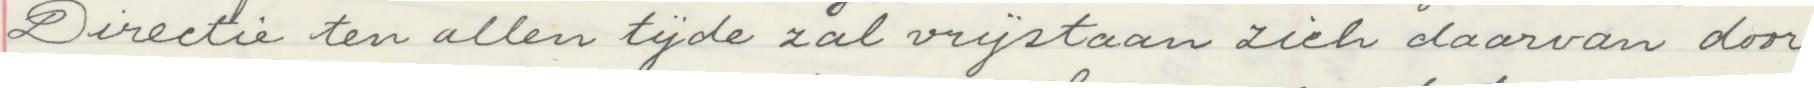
Directie ten allen tijde zal vrijstaan zich daarvan door
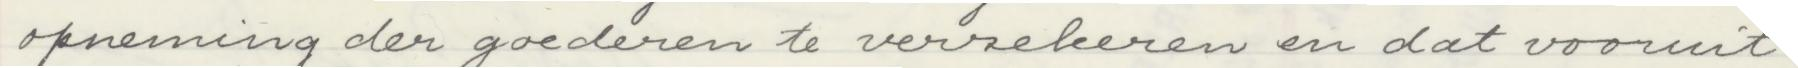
opneming der goederen te verzekeren en dat vooruit
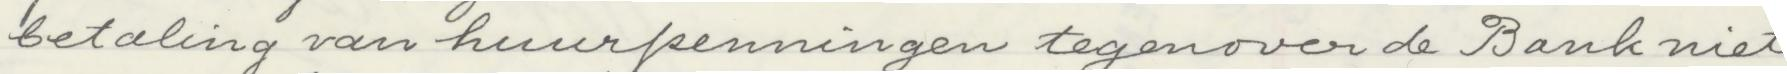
betaling van huurpenningen tegenover de Bank niet
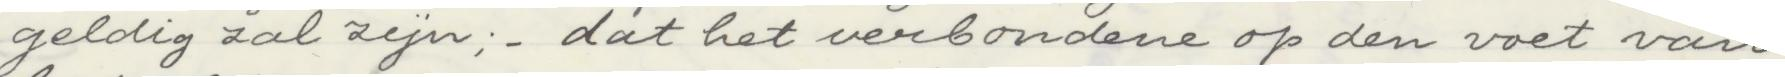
geldig zal zijn: - dat het verbondene op den voet van
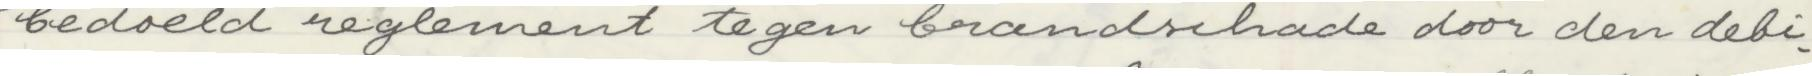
bedoeld reglement tegen brandschade door den debi
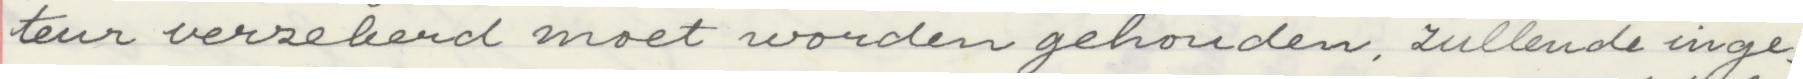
teur verzekerd moet worden gehouden, zullende inge-
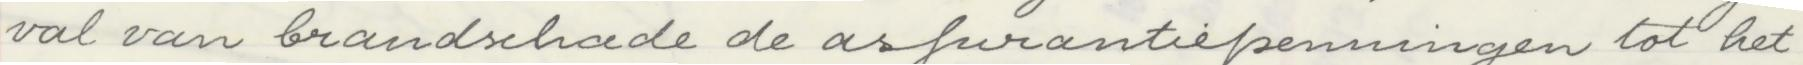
val van brandschade de assurantiepenningen tot het
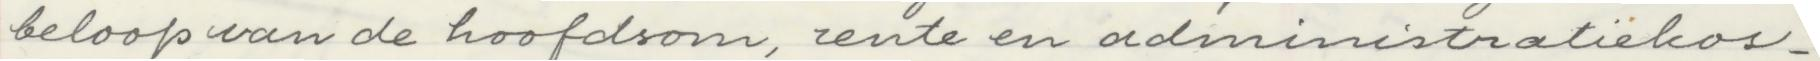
beloop van de hoofdsom, rente en administratiekos-
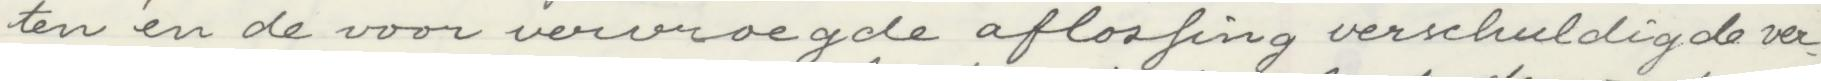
ten en de voor vervroegde aflossing verschuldigde ver
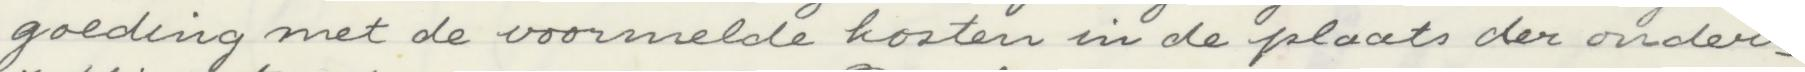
goeding met de voormelde kosten in de plaats der onder-
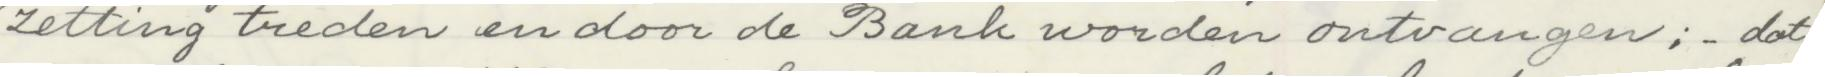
zetting treden en door de Bank worden ontvangen; - dat
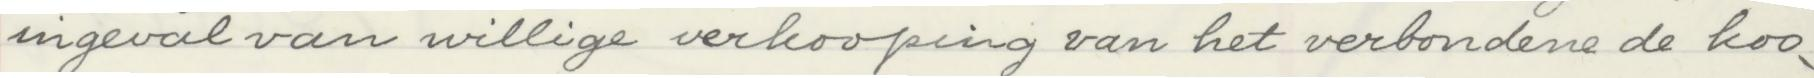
ingeval van willige verkooping van het verbondene de koo
